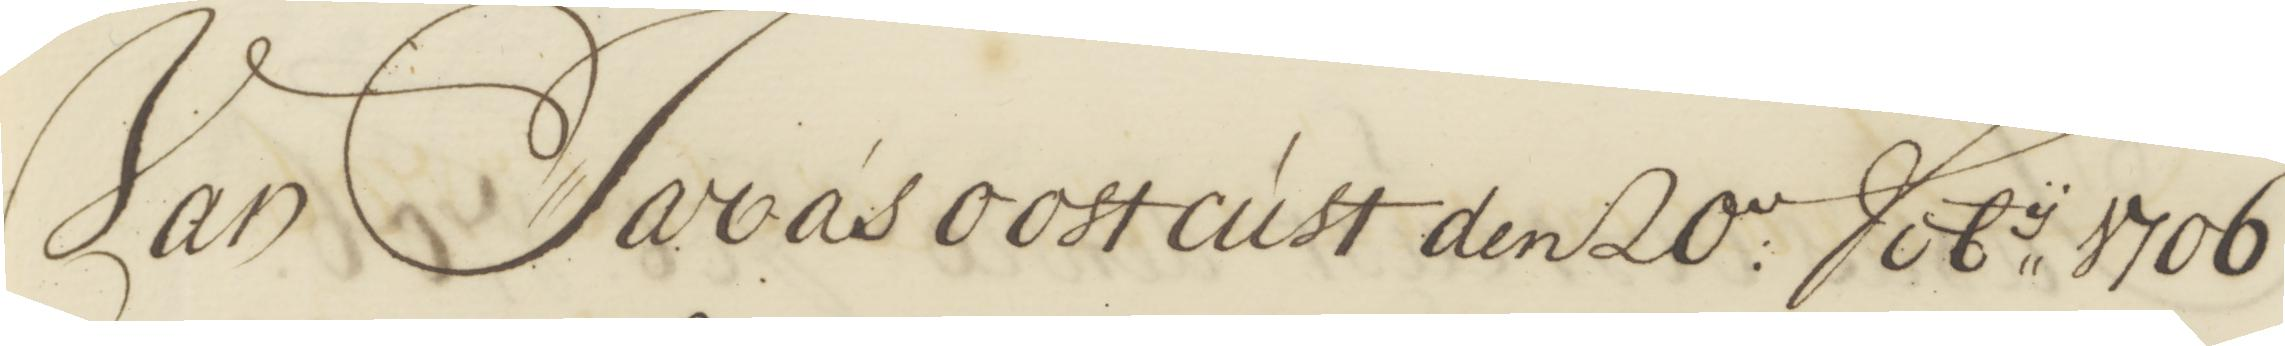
Van Java's oost cust den 20:e feb„ij 1706
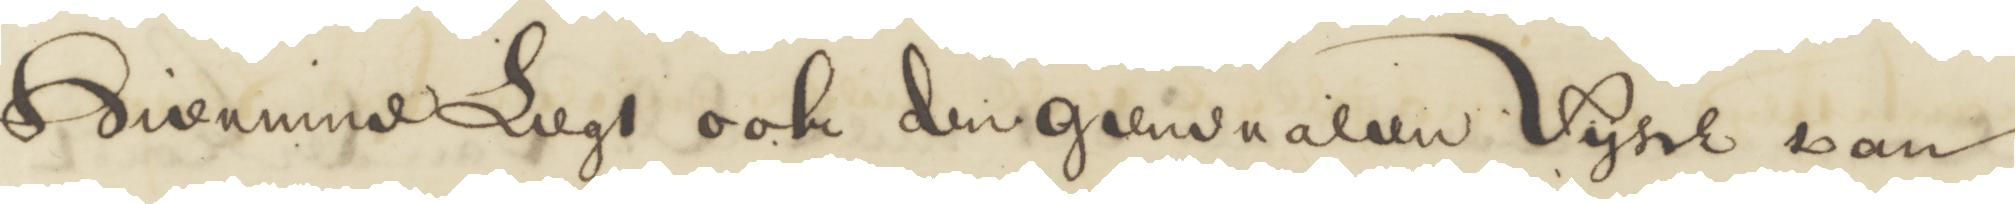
Hierinne Legt ook den generalen Eijsch van
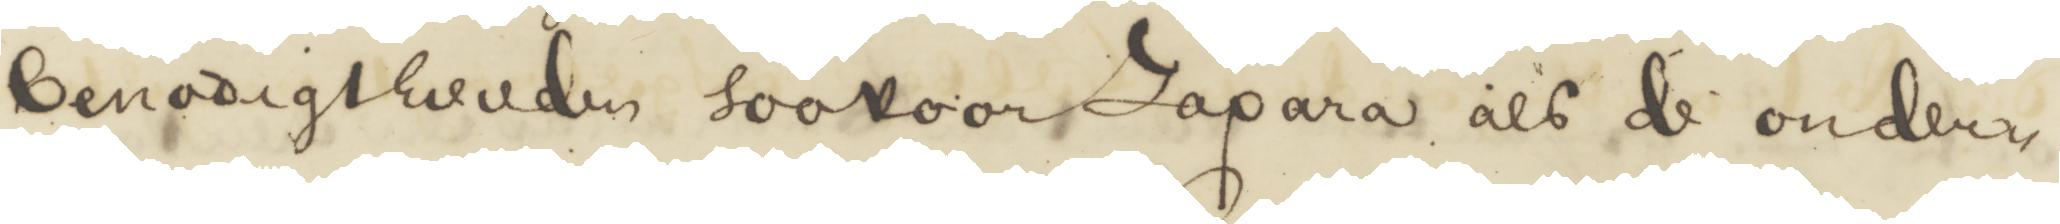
benodigtheeden soo voor Japara als de onder
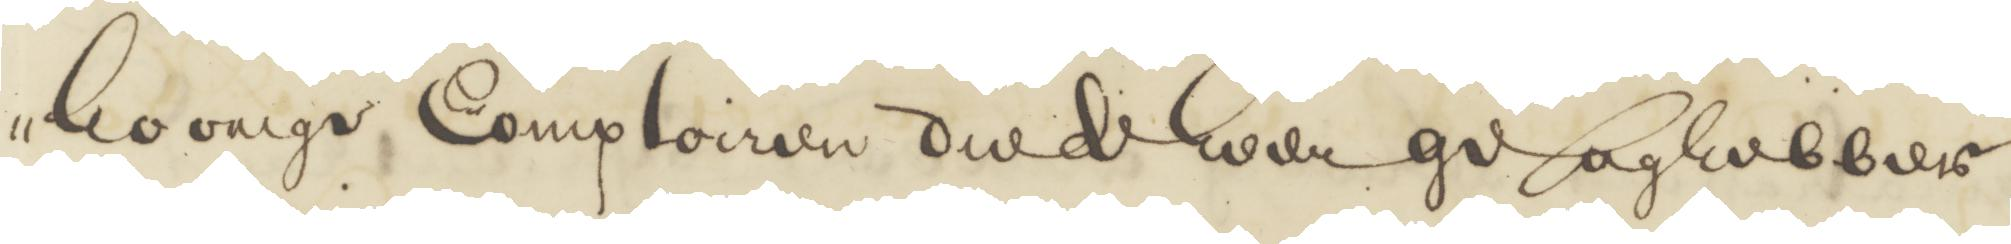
„hoorige Comptoiren die de heer gesaghebber
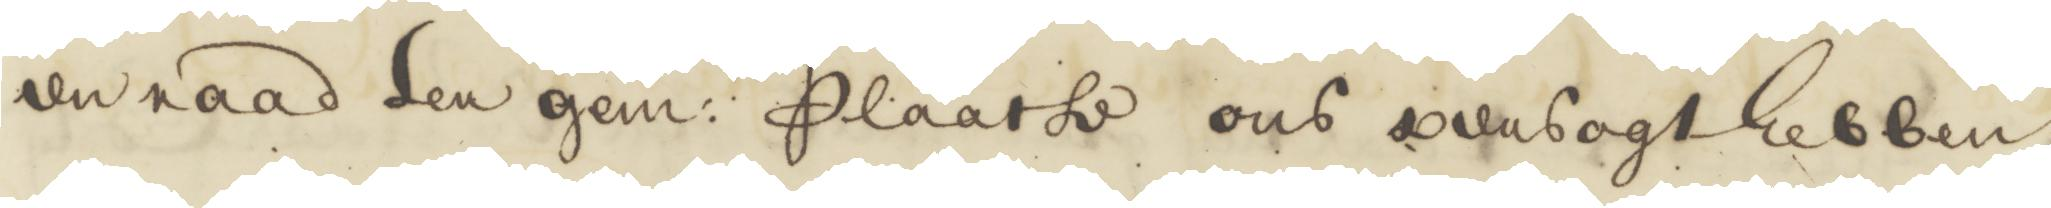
en raad ter gem:te plaatse ons versogt hebben
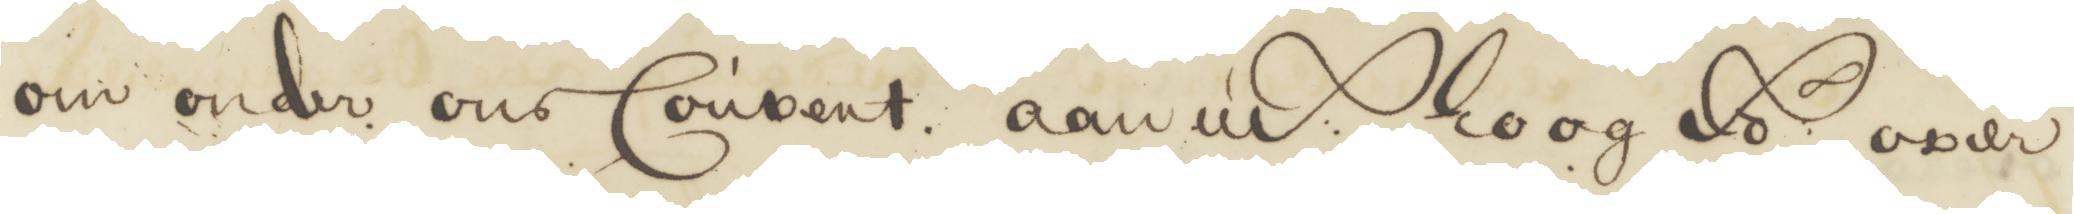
om onder ons Couvert. aan uE: hoog Ed:s over
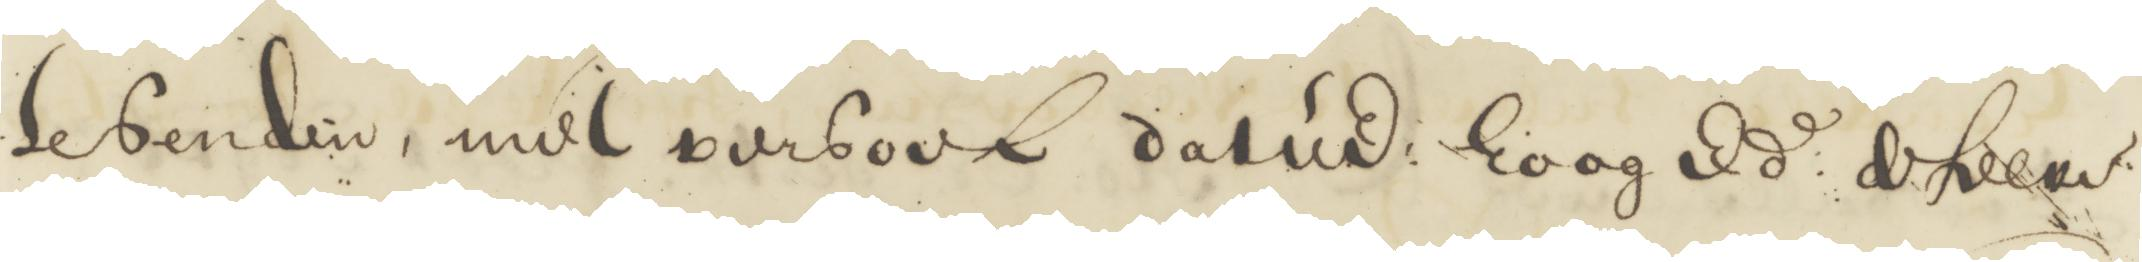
te senden, met versoek dat uE: hoog Ed:e de Selve
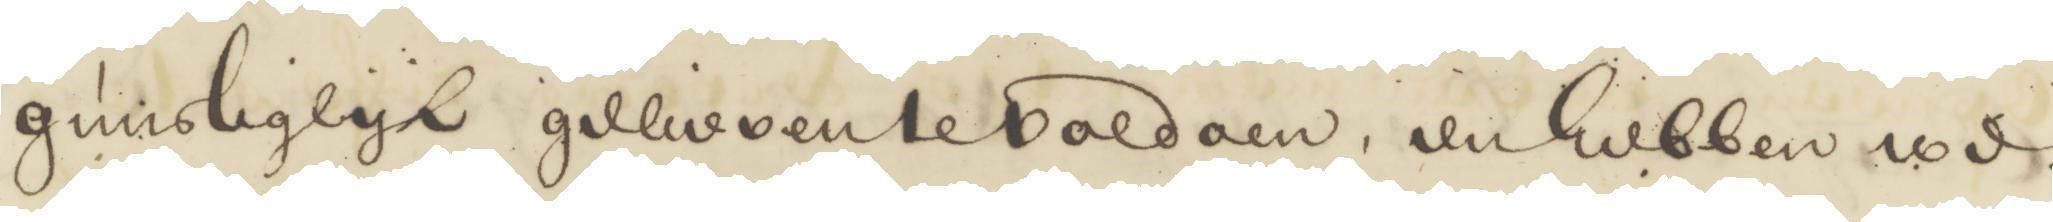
gunstiglijk gelieven te voldoen, en hebben we
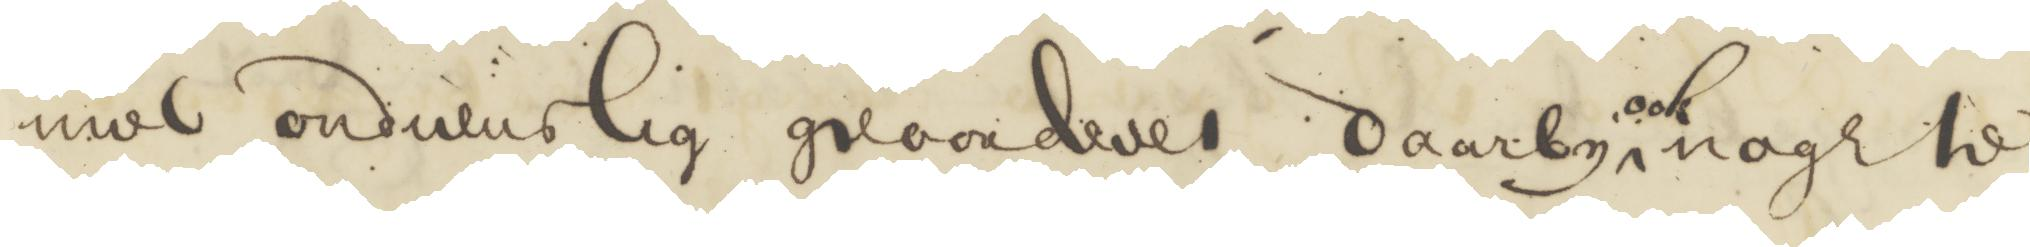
niet ondienstig geoordeelt daarbij ^ook nogh te
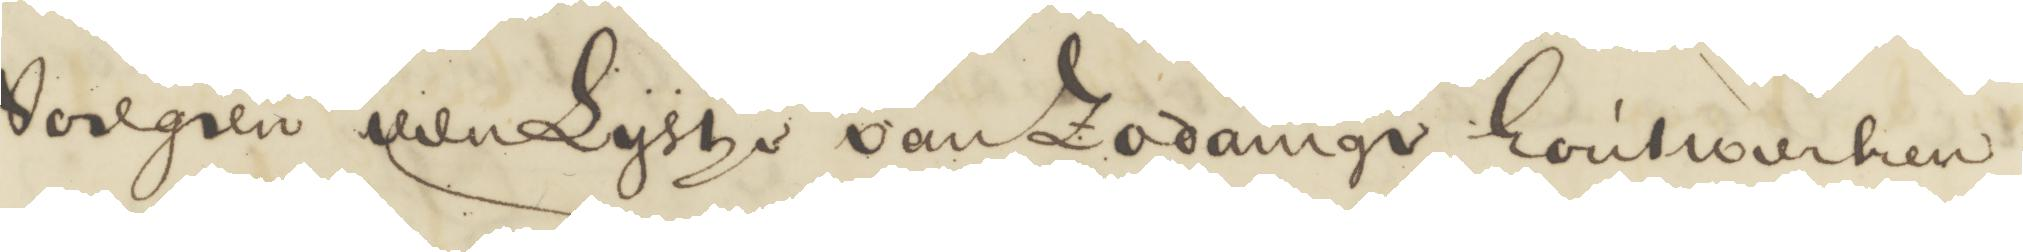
Voegen een Lijstje van Zodanige houtwerken
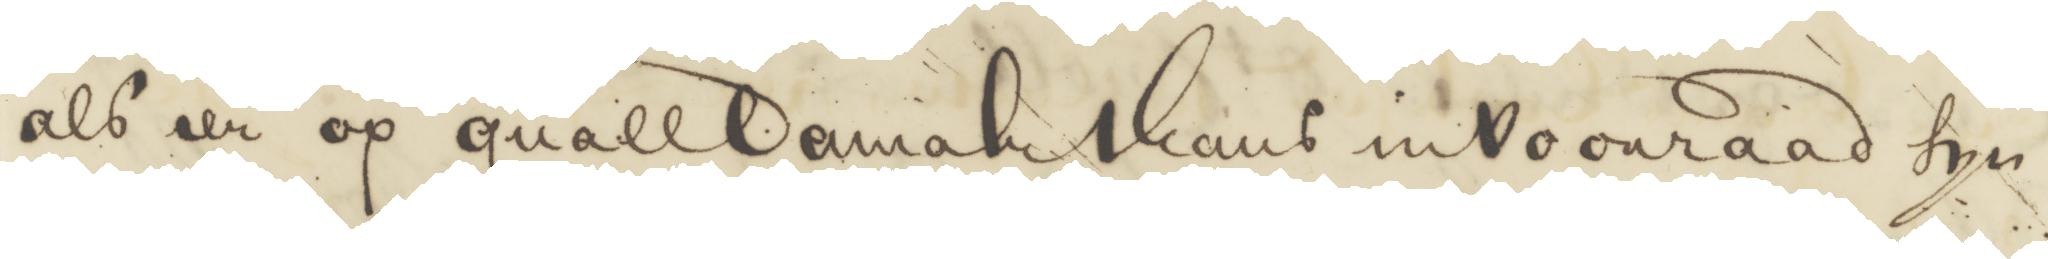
als er op qualldamak thans in voorraad sijn
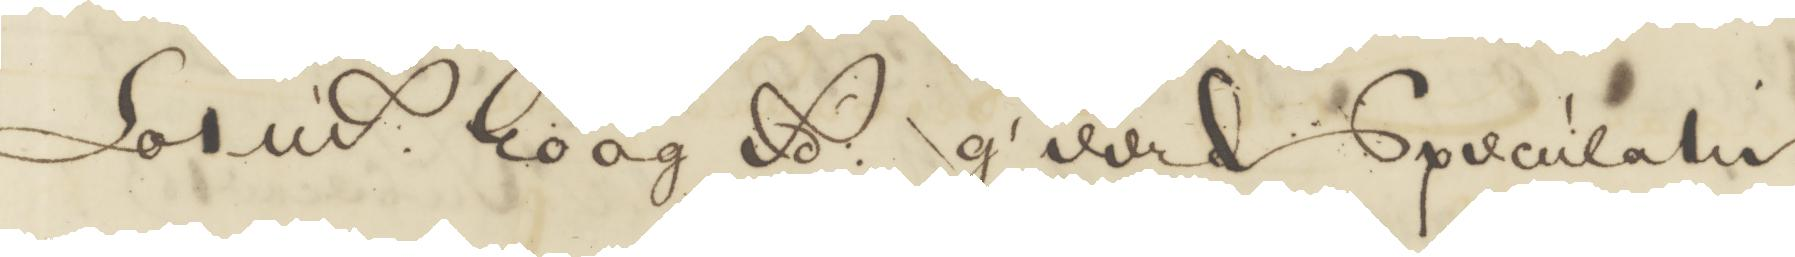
tot uE: hoog Ed: \g’eerde Speculatie
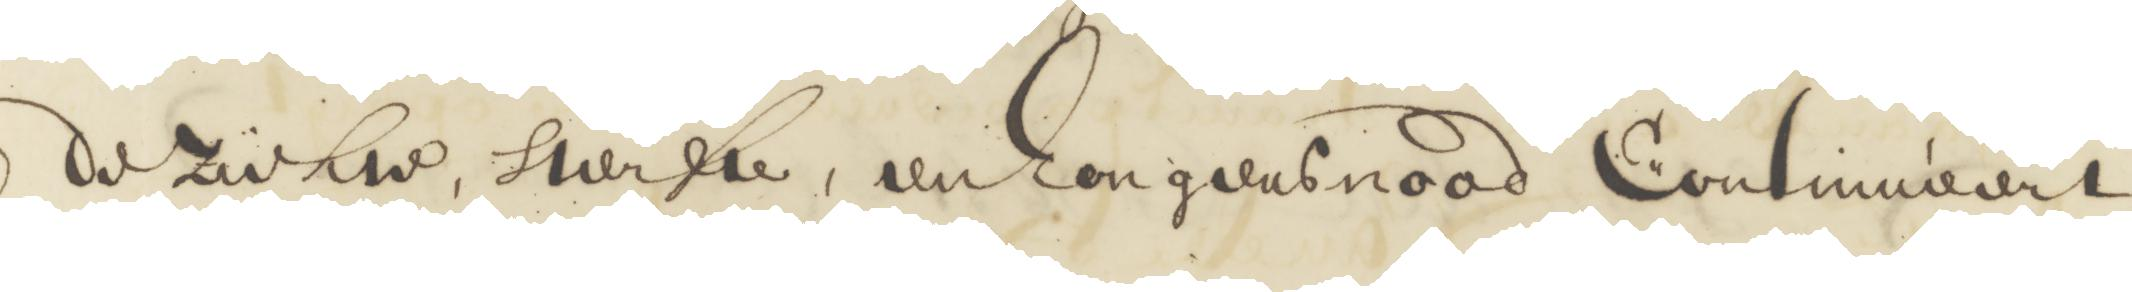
de ziekte, sterfte, en hongersnood Continueert
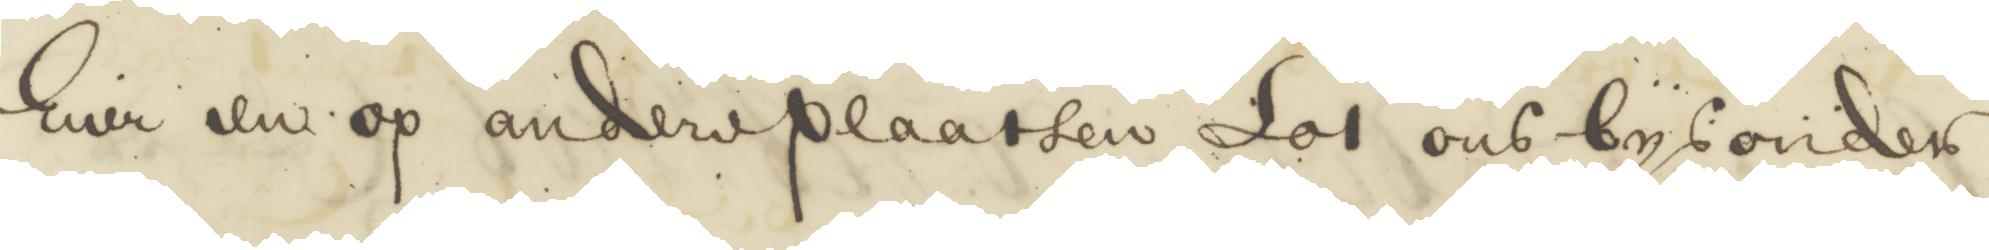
hier en op andere plaatsen Tot ons bijsonder
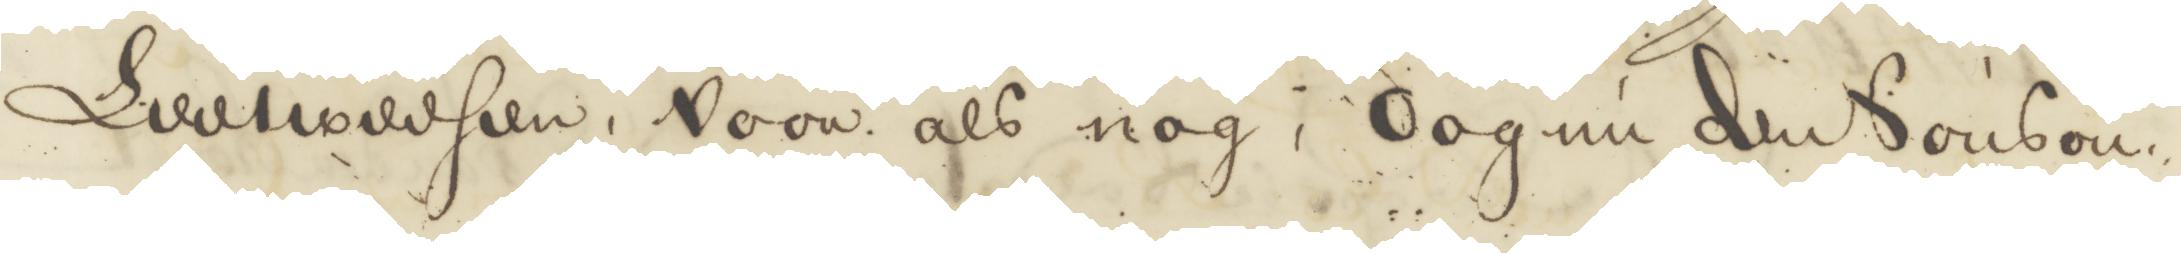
Leetweesen, voor als nog; dog nu den Sousou„
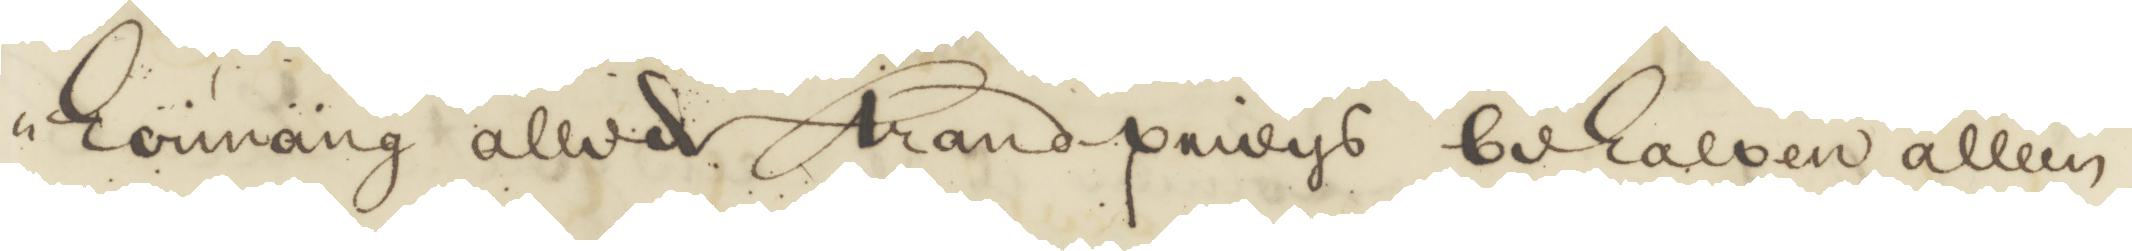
„hounang alle de Strandprieys behalven alleen
